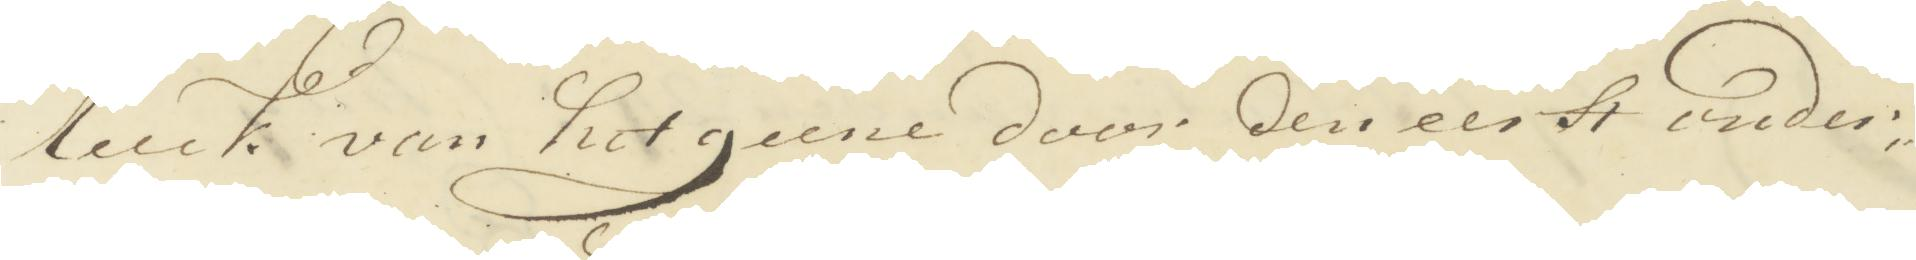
reeck van het geene door den eerst onder„
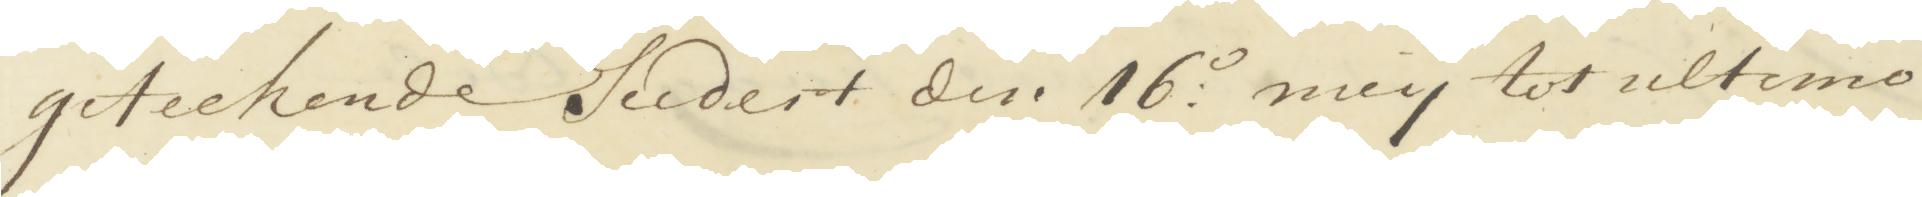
geteekende seedert den 16:' meij tot ultimo
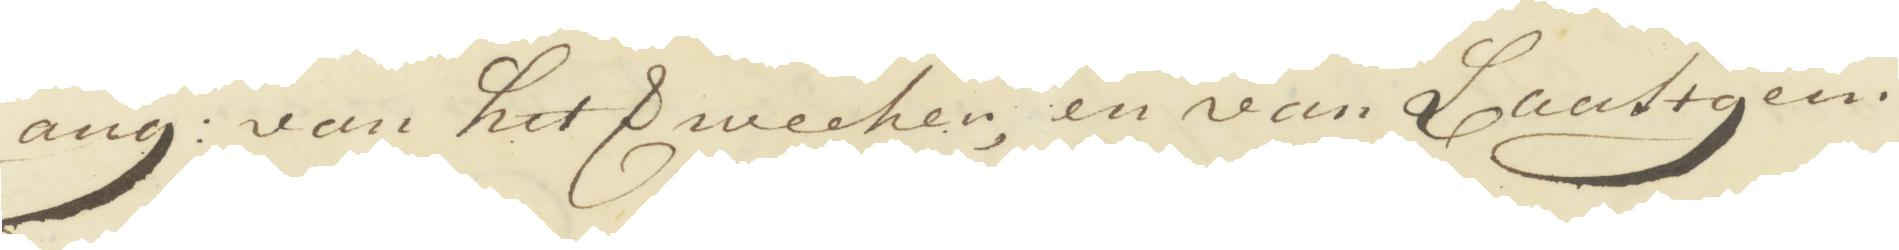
aug: van het verweeker, en van Laastgen
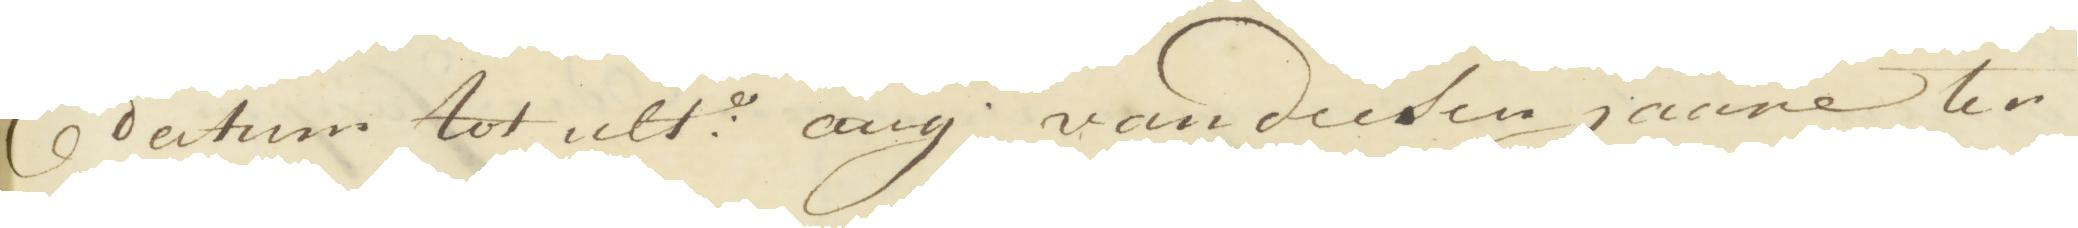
datum tot ult:o aug.s van deeser jaare ter
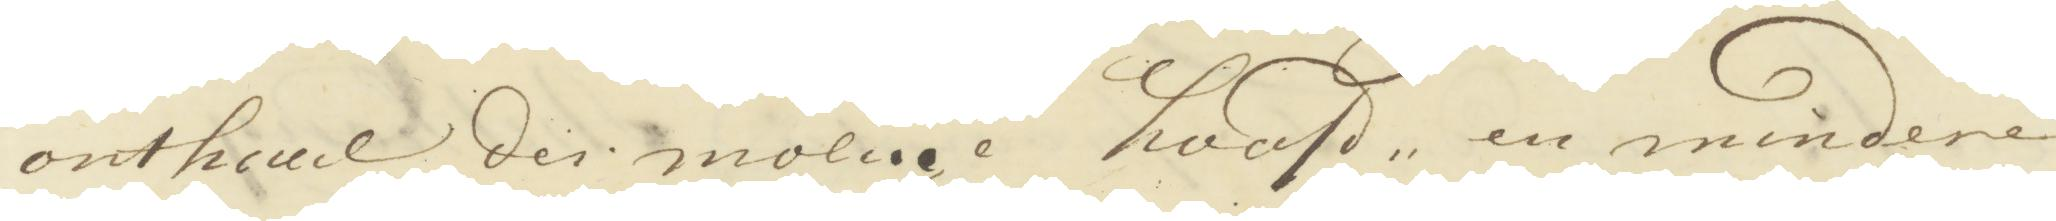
onthaal der moluxe hoofd „ en mindere
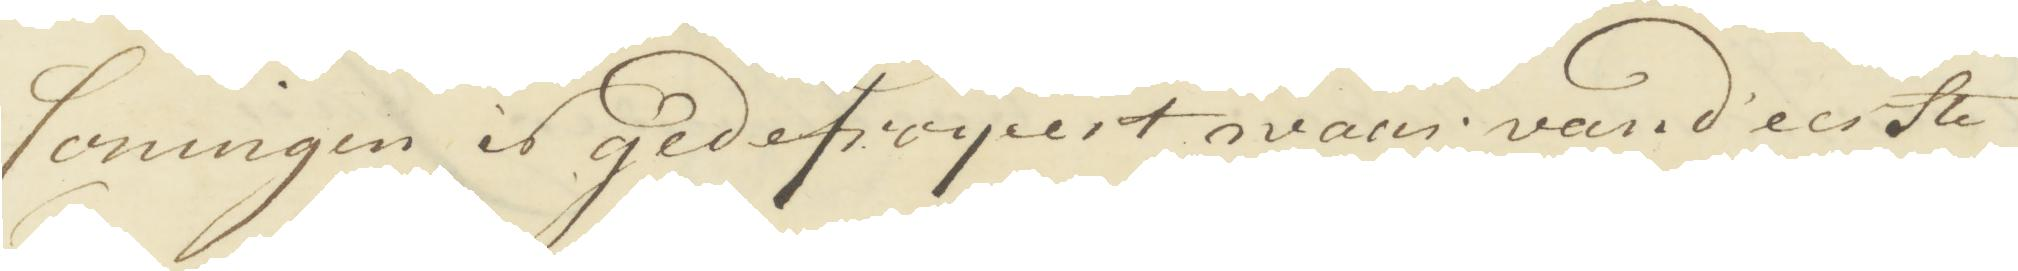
Coningen is gedefroijeert waar van d’ eerste
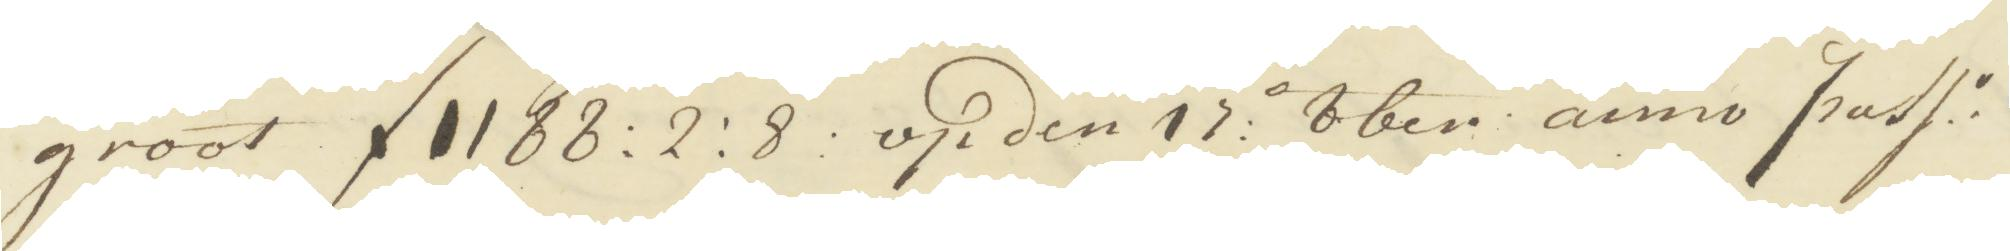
groot ƒ1188: 2: 8: op den 17:' 8ber: anno pass:o
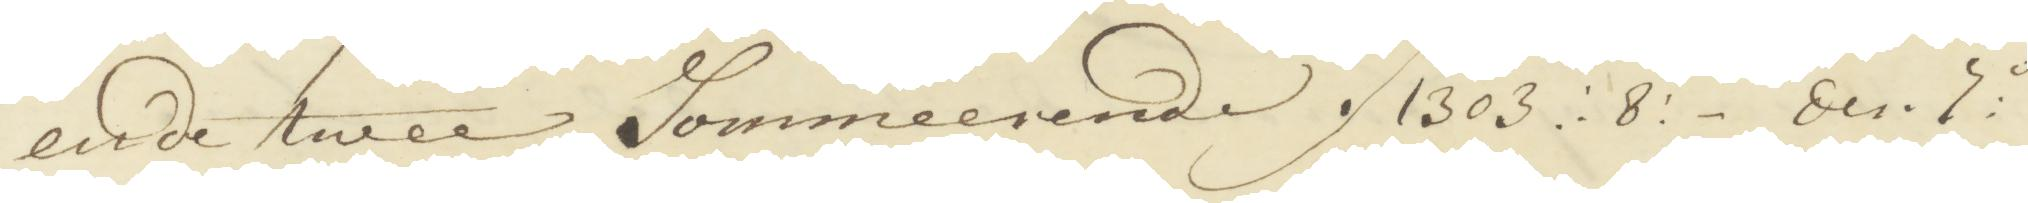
ende twee sommeerende ƒ1303. : 8: – den 7:o
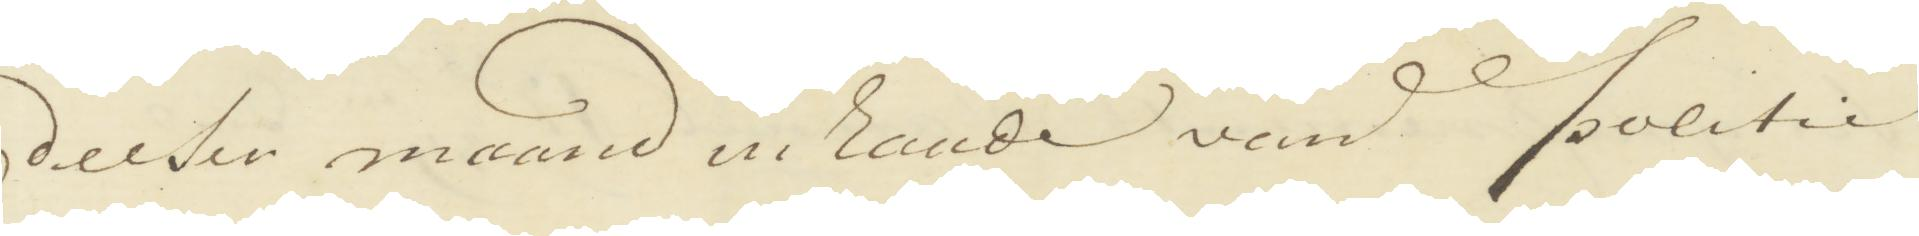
deeser maand in hande van politie
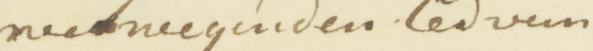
weswegen den Eed van
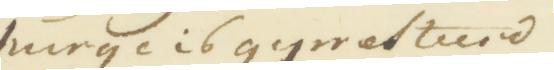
purge is gepresteerd
